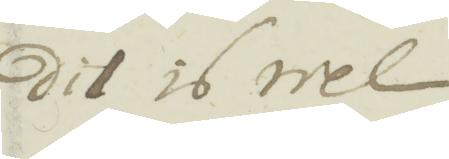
dit is wel
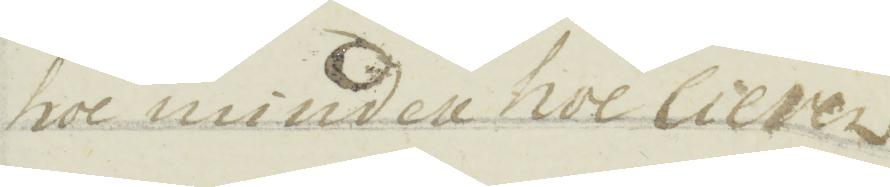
hoe minder hoe lieven
